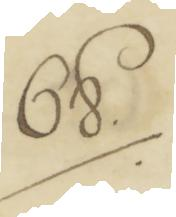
68./.
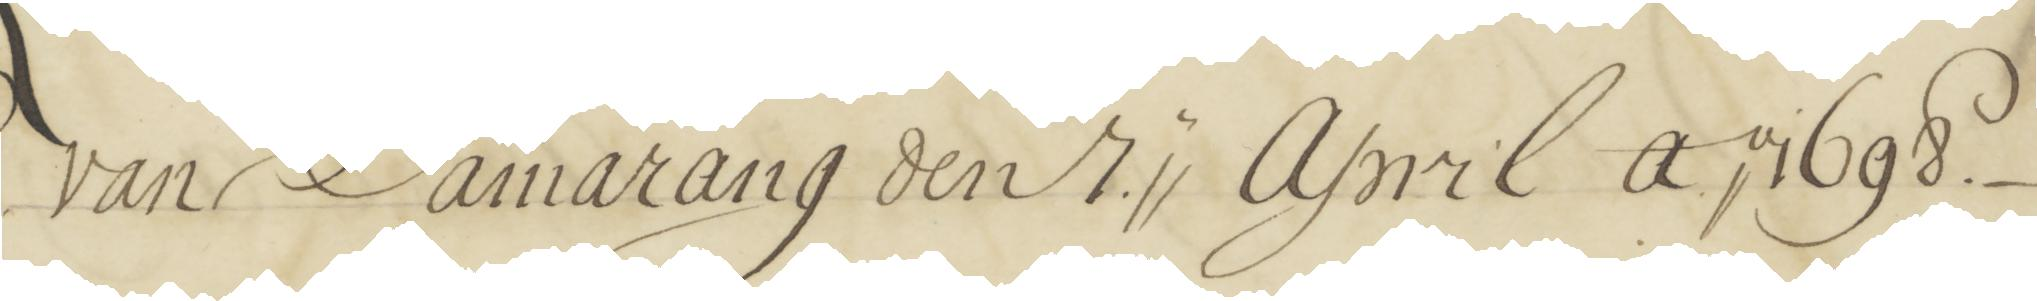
Van Samarang den 7„en April a„o 1698. —
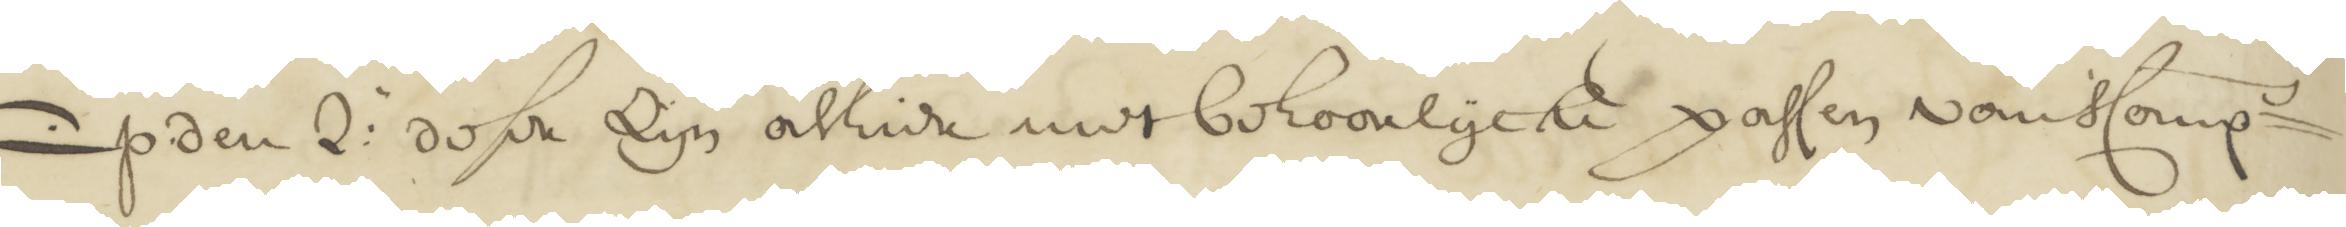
Op den 2: deser zijn alhier met behoorlijcke passen van 'sComp=s
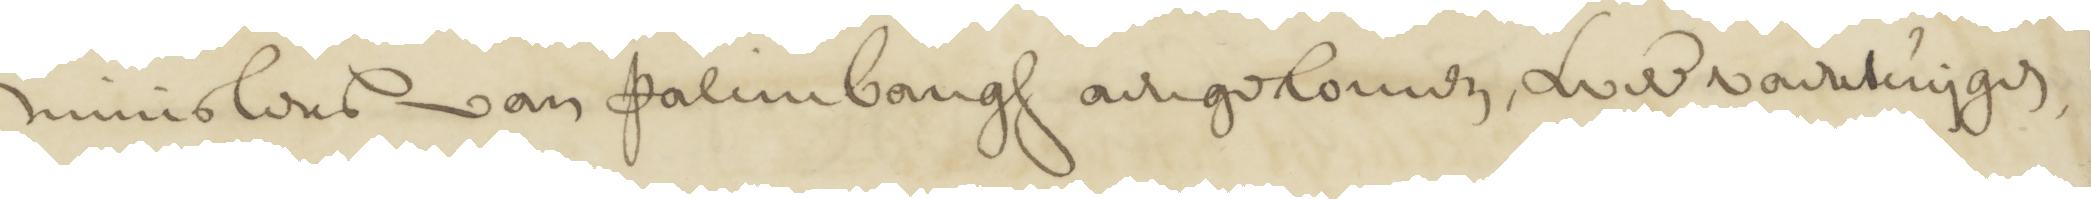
ministers van palimbangh aengekomen, twee vaertuijgen,
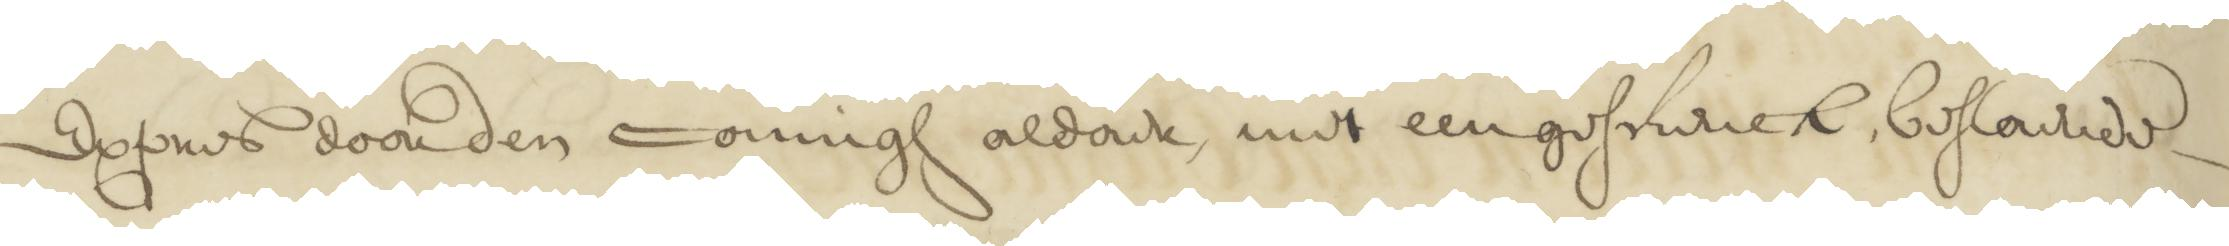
Expres door den coningh aldaer, met een geschenck, bestaende
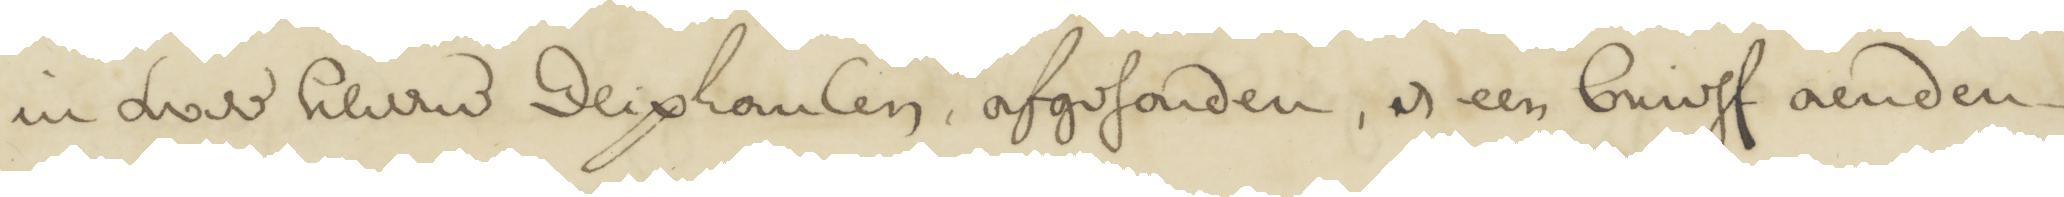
in twee kleene Eliphanten, afgesonden, en een brieff aenden
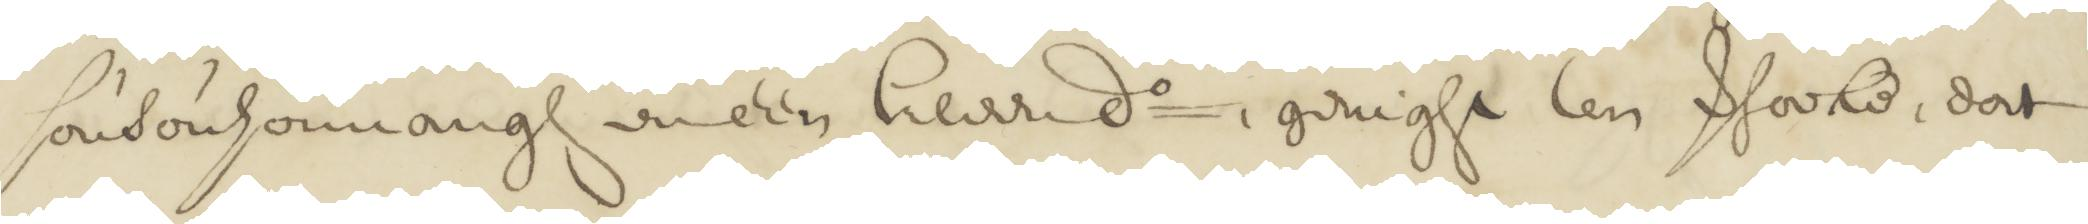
sousouhounangh en een kleen d=o, geright ten versoeke, dat
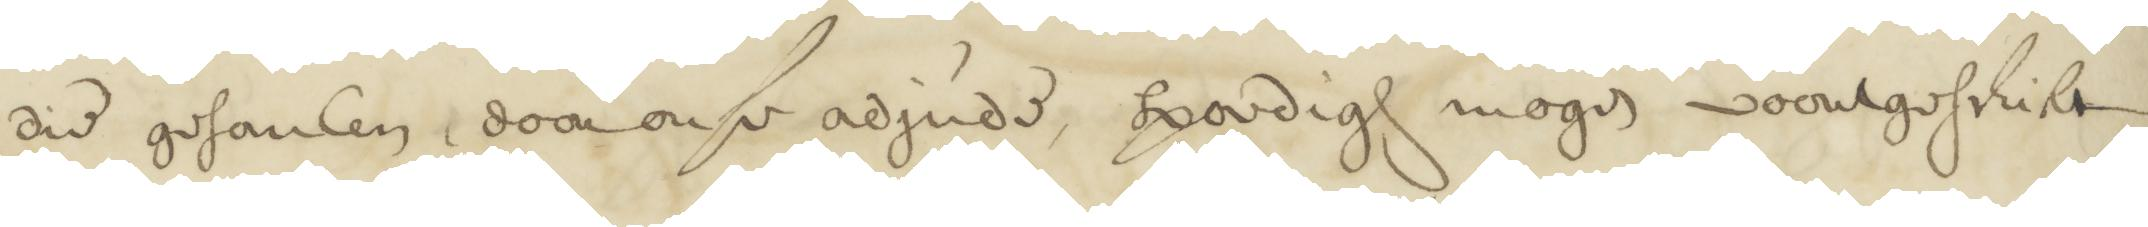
die gesanten door onse adjude, spoedigh mogen voortgeschikt
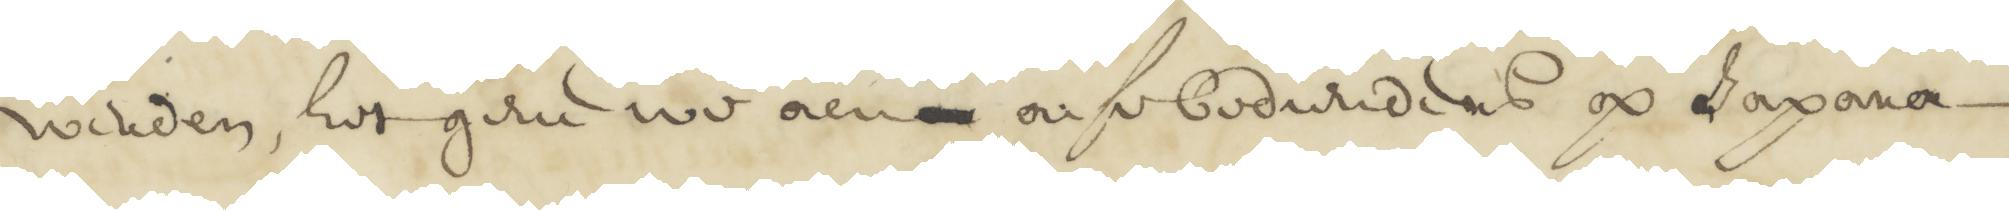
werden, het gene we aen onse bedienders op Iapara
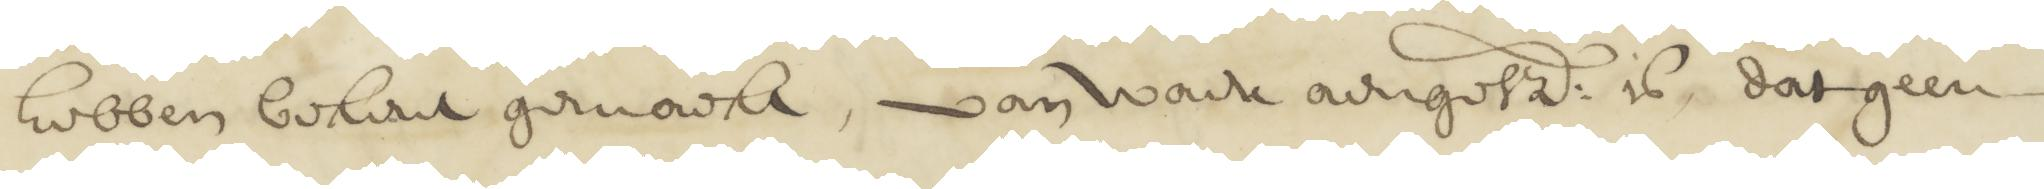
hebben bekent gemaekt, van waer aengesz: is, dat geen
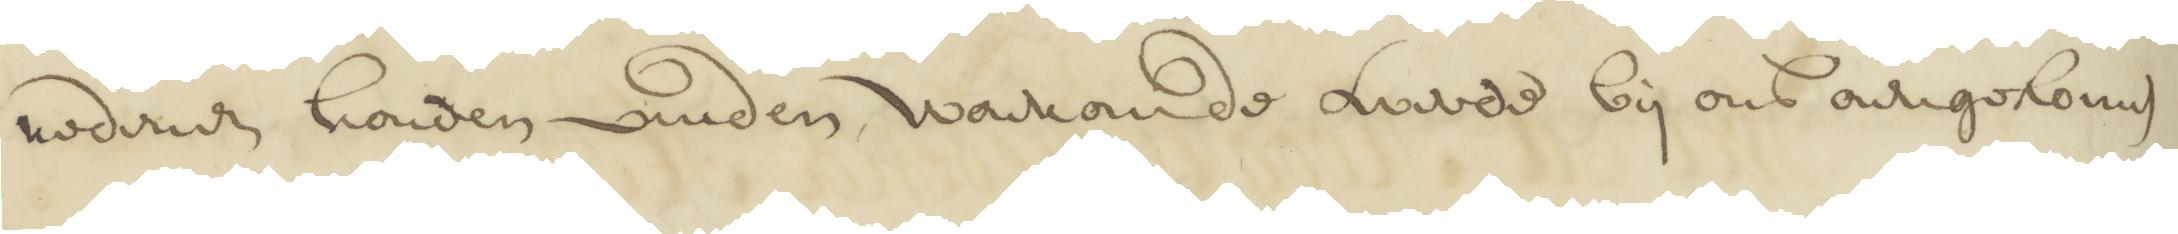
redenen konden vinden, waerom de tweede bij ons aengekomen
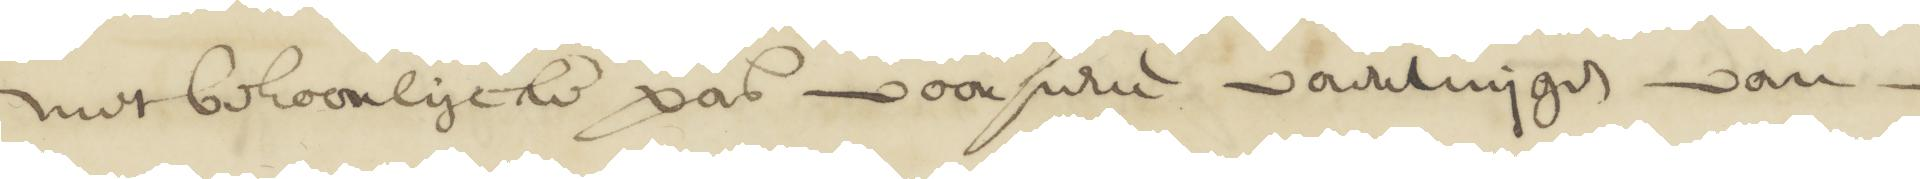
met behoorlijcke pas voorsiene vaertuijgen van
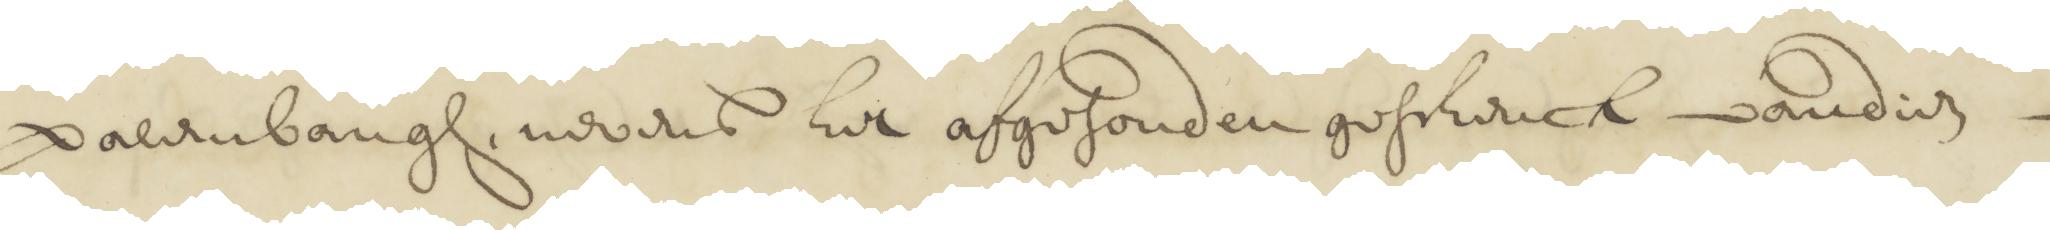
palembangh, nevens het afgesonden geschenck vandien
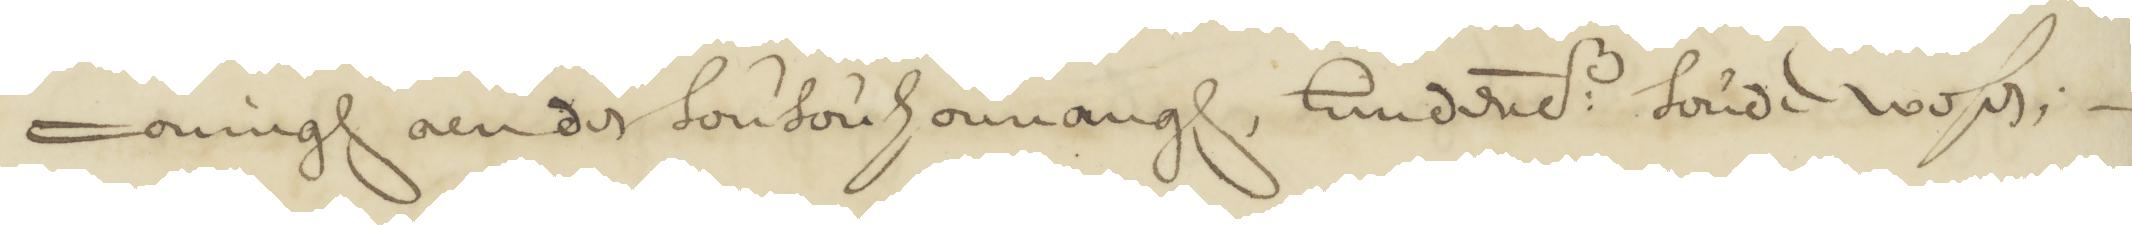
coningh aen den sousouhounangh, hinderlijk soude wesen; —
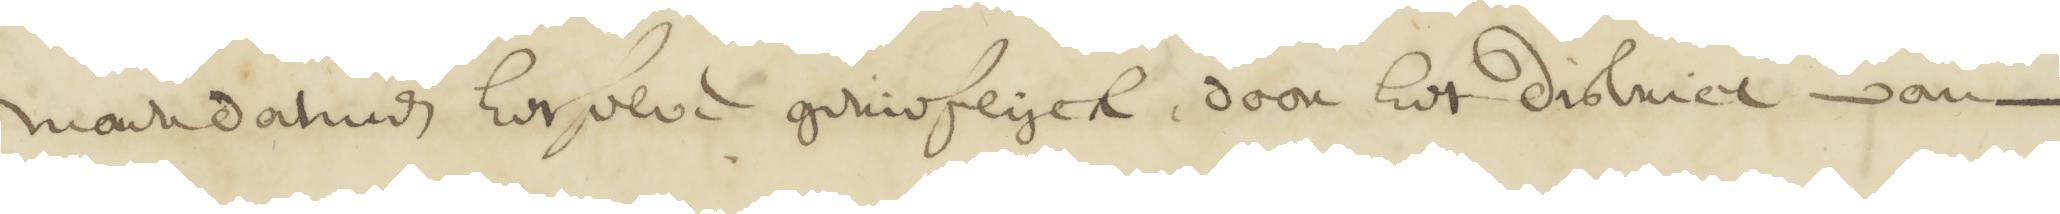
maerdatmen hetselve gerieflijck, door het district van
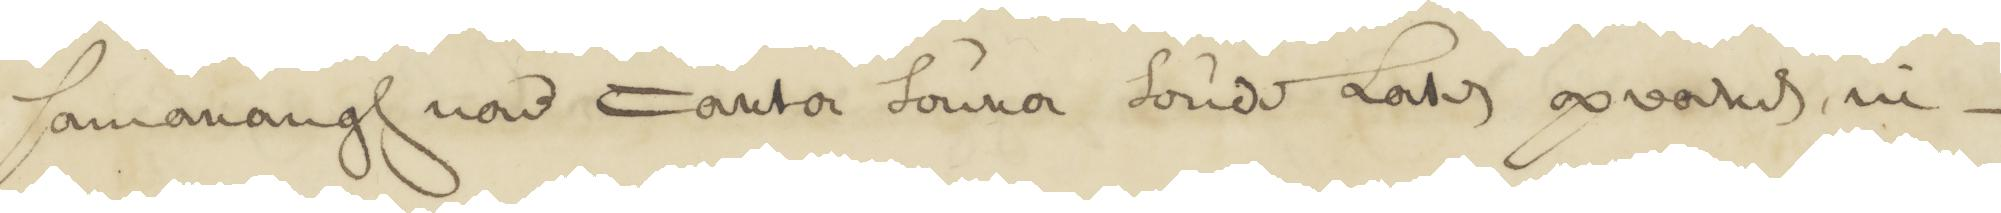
samarangh nae carta soura soude laten opvoeren, in
